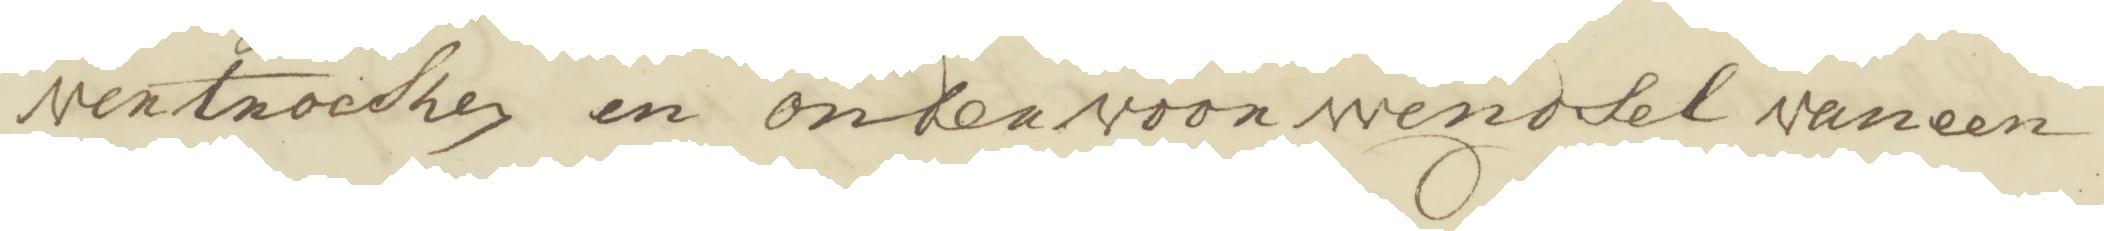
vertrocken en onder voor wendsel van een
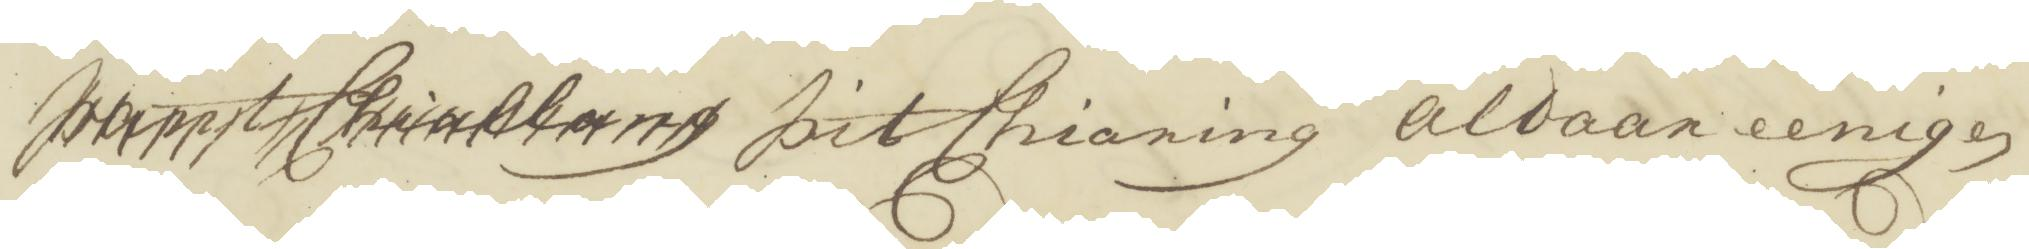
pant Chiallang pit Chiaring aldaar eenigen
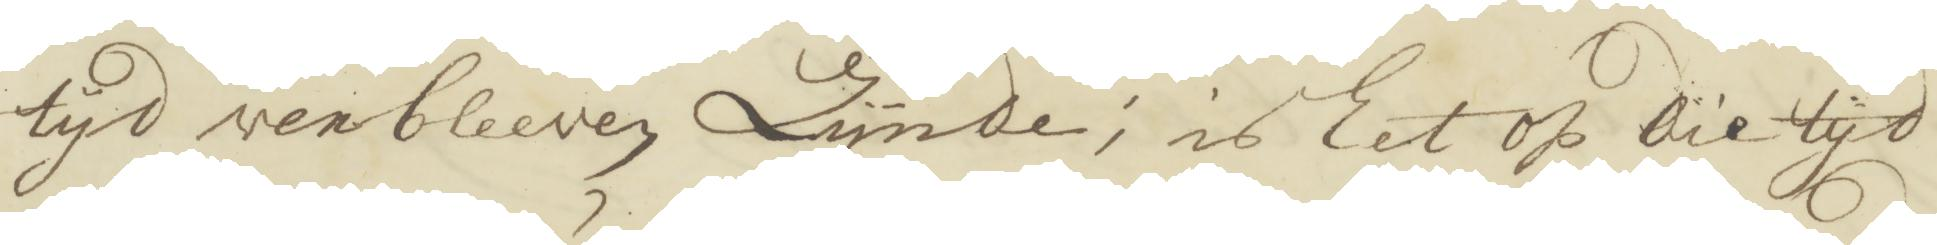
tijd verbleeven zijnde; is het op die tijd
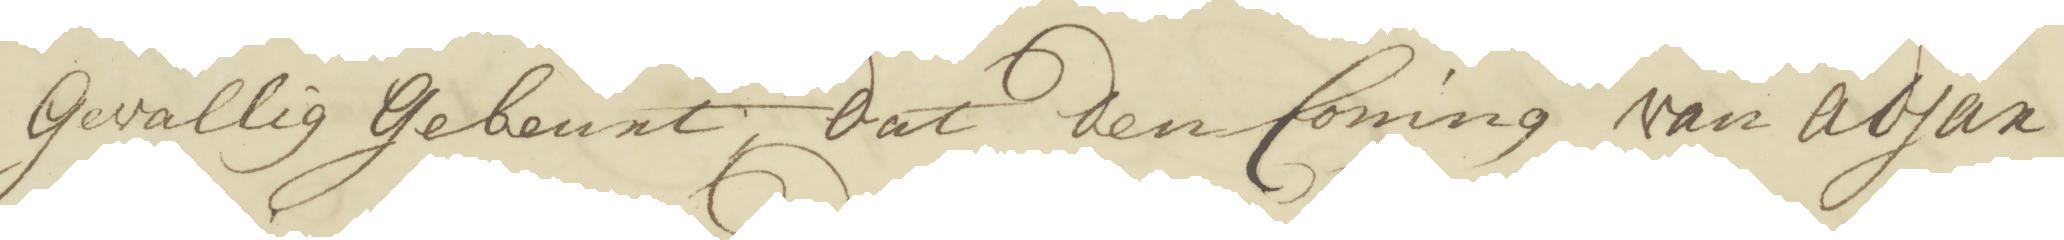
gevallig gebeurt; dat den Coning van adjar
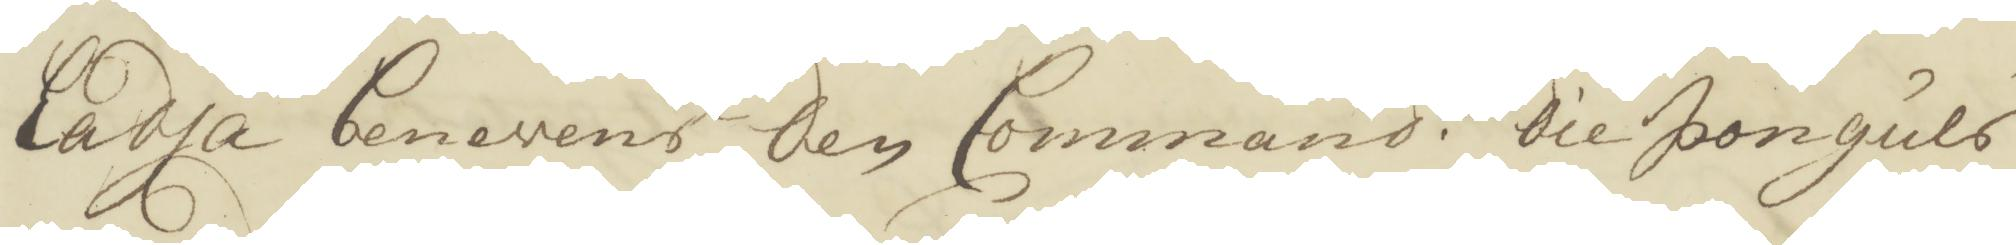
hadja benevens den Command: die ponguls
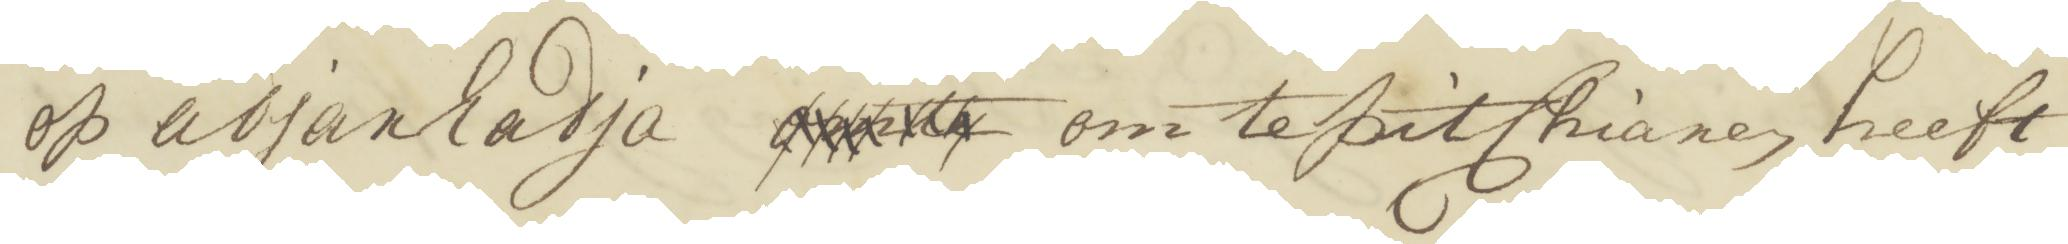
op adjarhadja omte om te pit Chiaren heeft
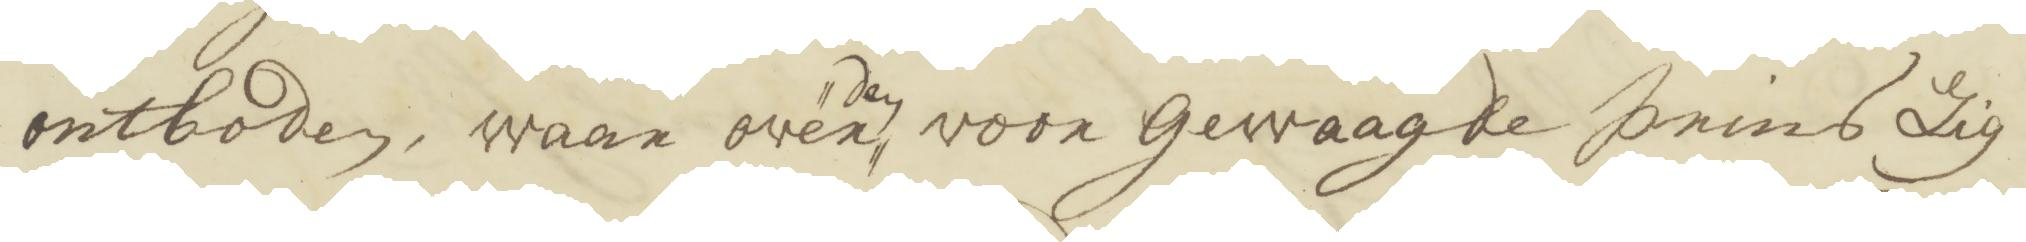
ontboden, waar over„den„ voor gewaagde prins zig
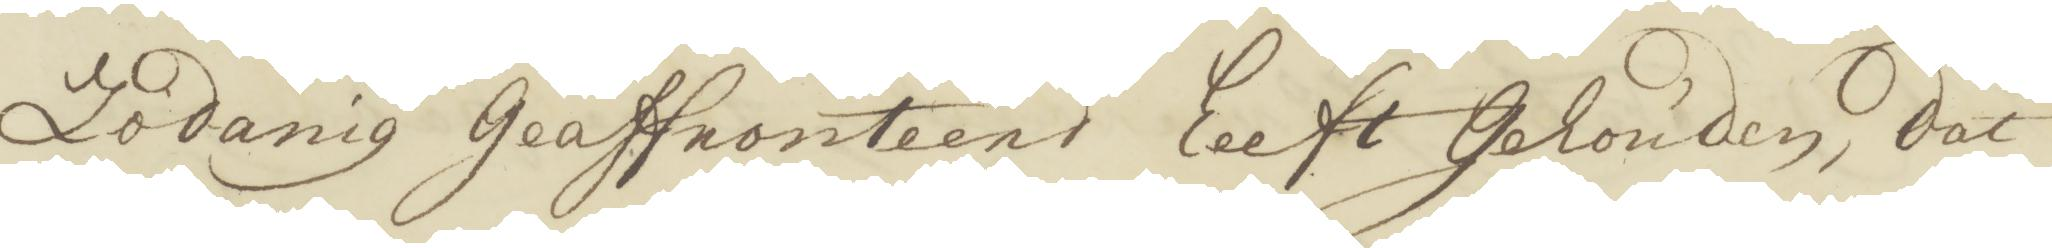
zodanig geaffronteerd heeft gehouden, dat
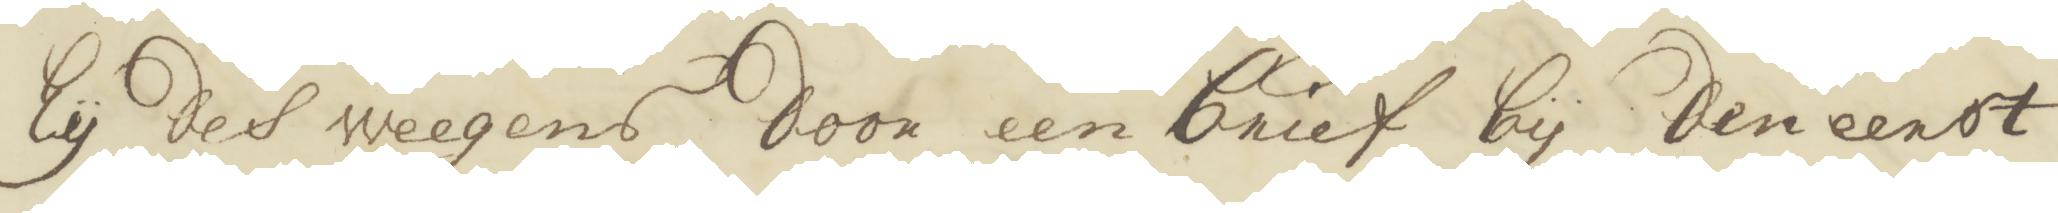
hij des weegens door een brief bij den eerst
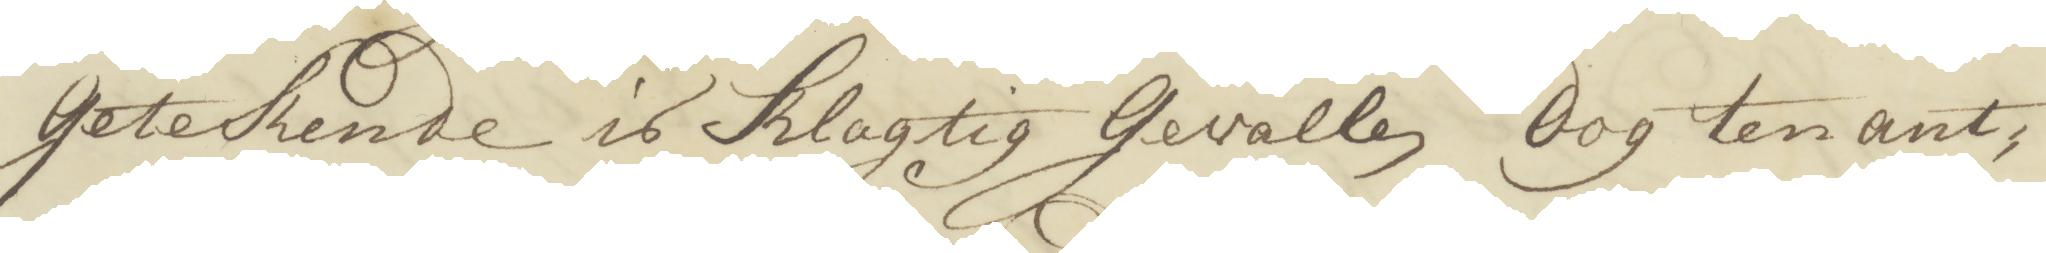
getekende is klagtig gevallen dog ten ant„
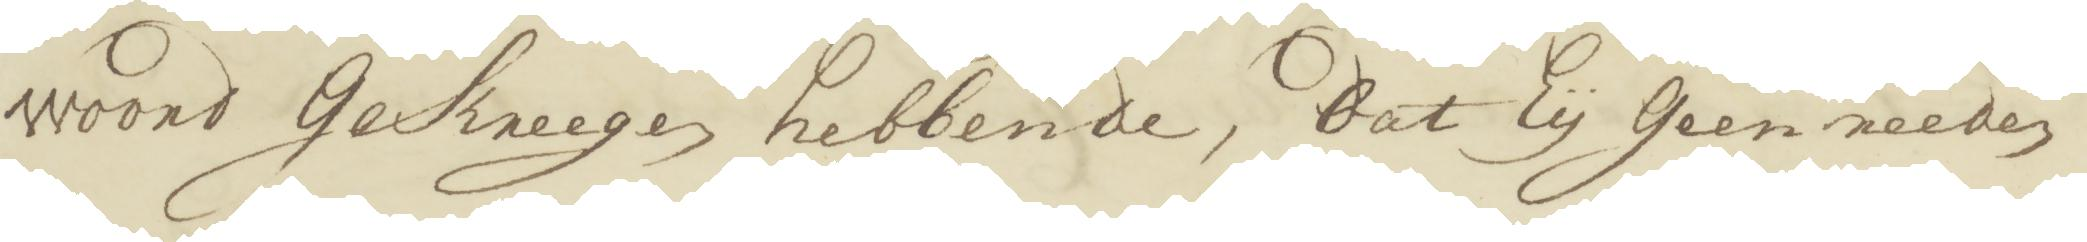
woord gekreegen hebbende, dat hij geen reeden
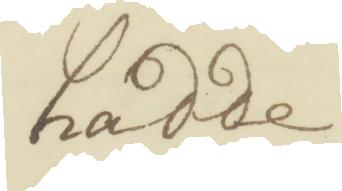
hadde.
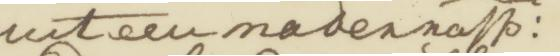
uit een nader rapp:t
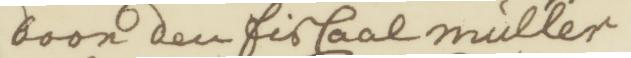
door den fiscaal muller
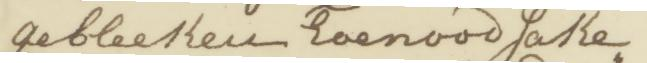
gebleeken hoenood sake„
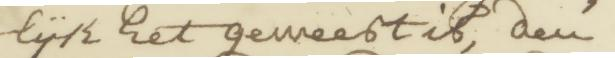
lijk het geweest is, den
